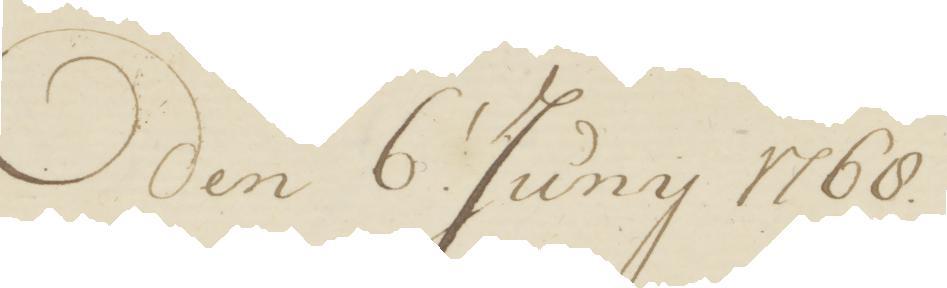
den 6.' Junij 1768.
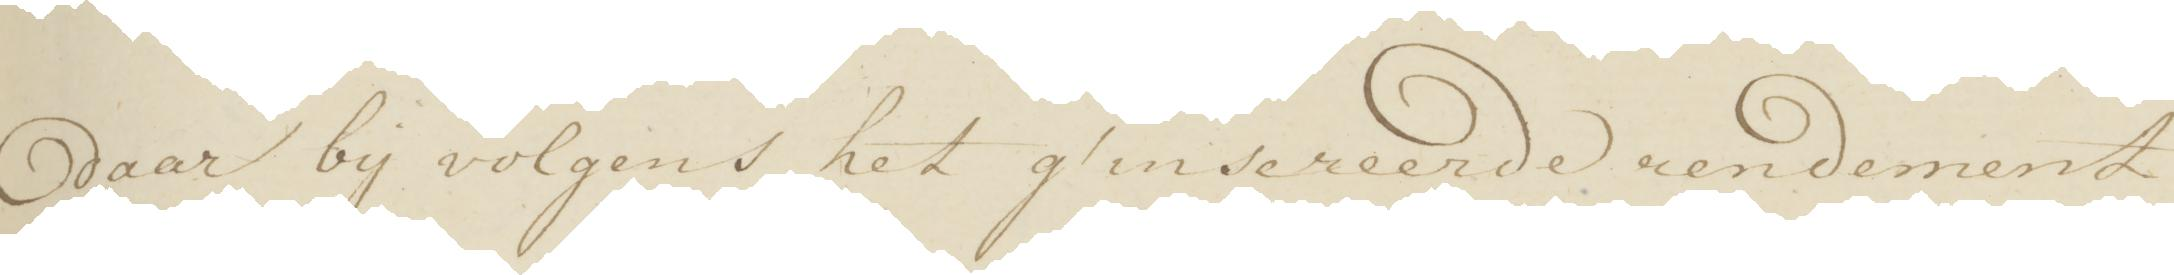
daar bij volgens het g'insereerde rendement
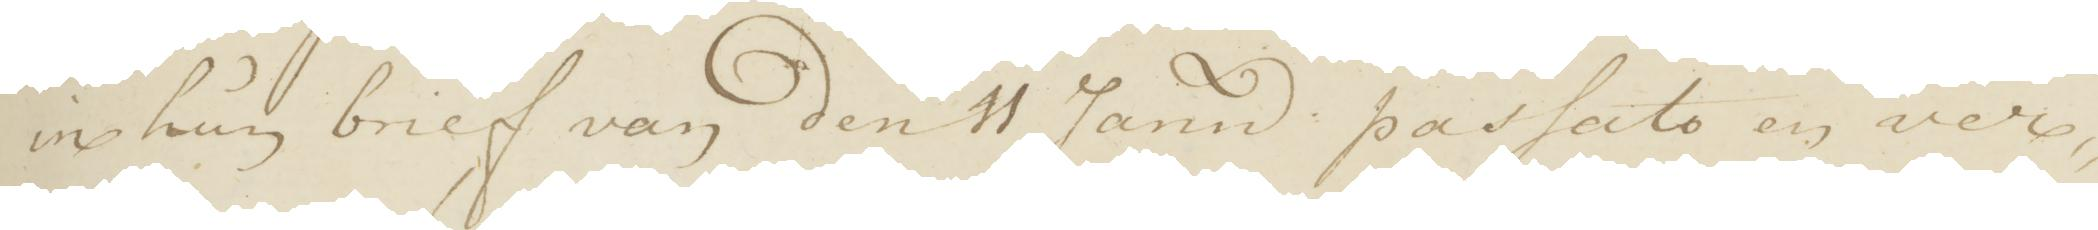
in hun brief van den 11 Jann: passato en ver„
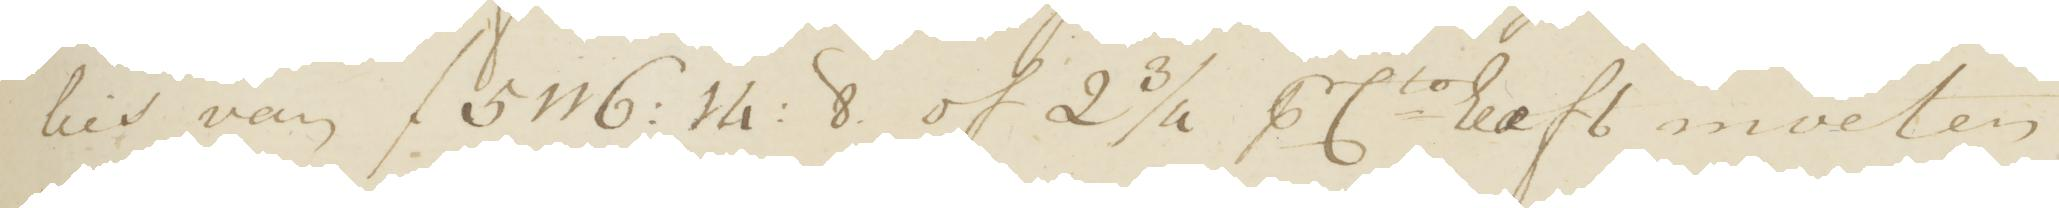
lies van ƒ 5116: 14: 8. of 2¾ prc=to heeft moeten
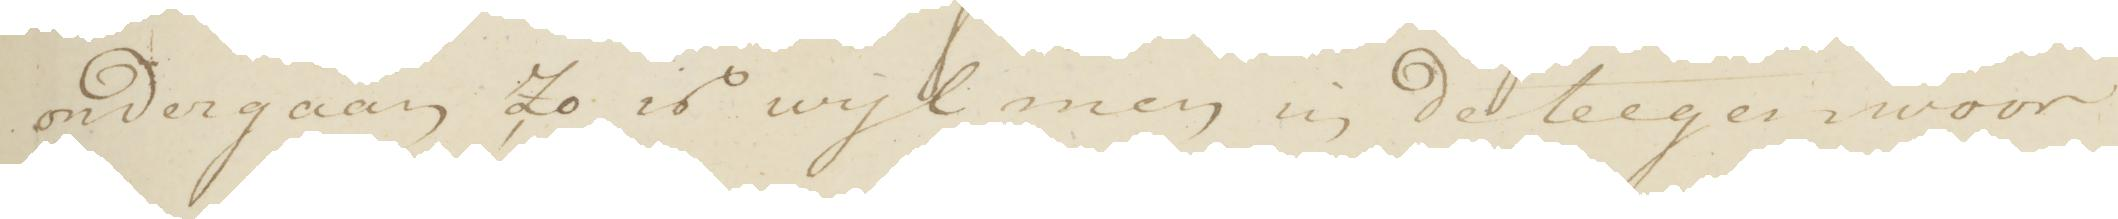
ondergaan, zo is wijl men in de teegenwoor
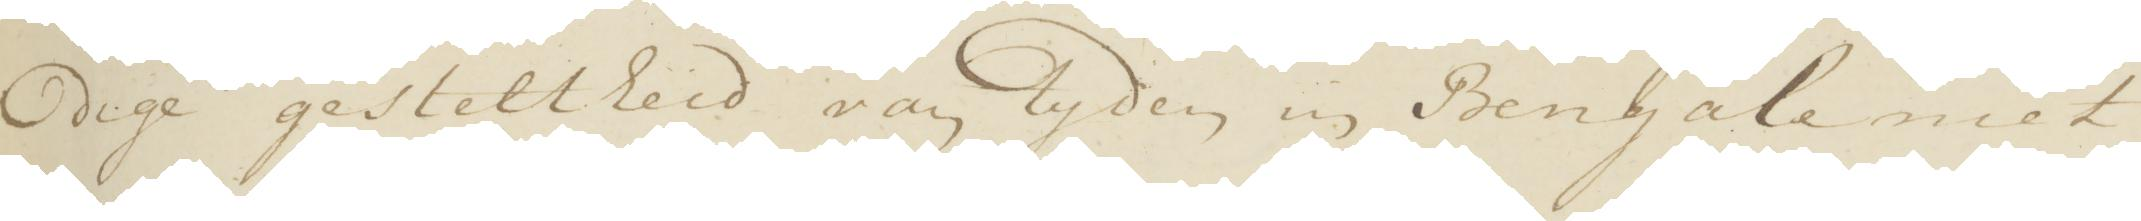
dige gesteltheid van tyden in Bengale niet
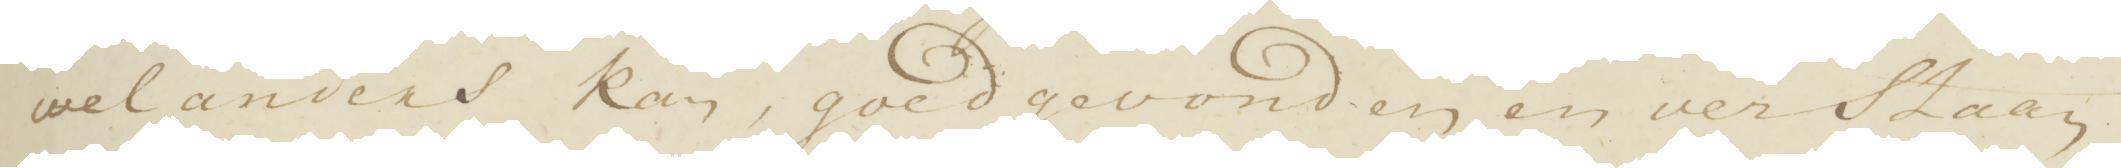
wel anders kan, goed gevonden en verstaan
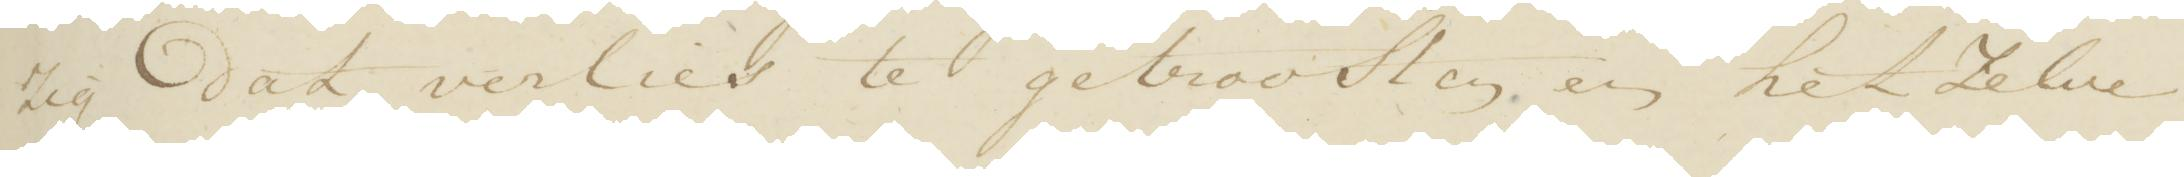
zig dat verlies te getroosten en hetzelve
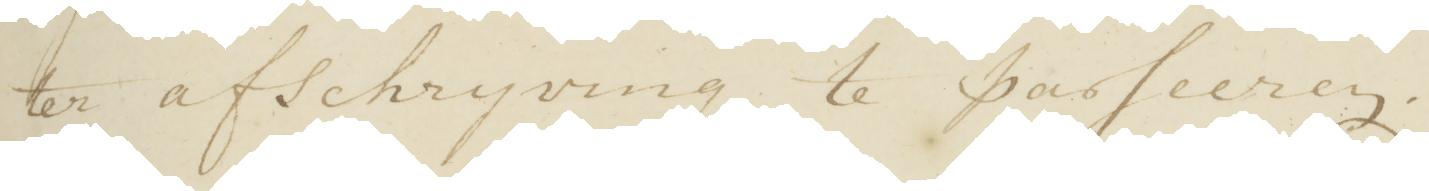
ter afschryving te passeeren.
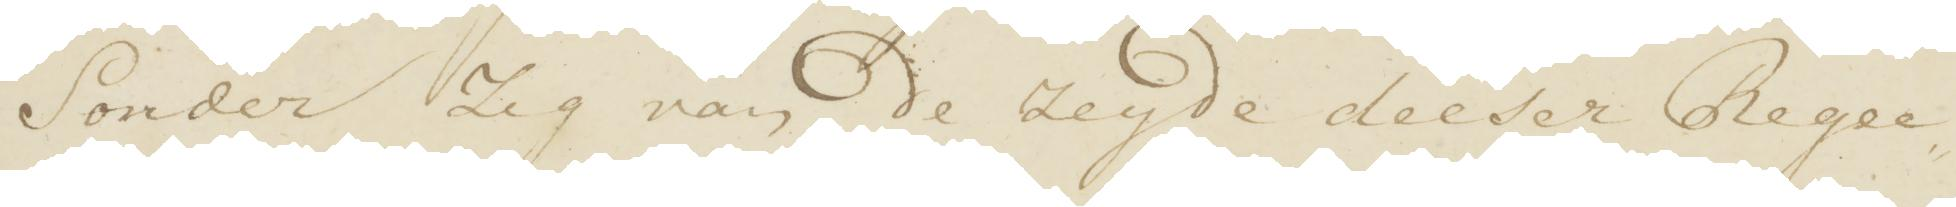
Sonder zig van de zeijde deeser Regee„
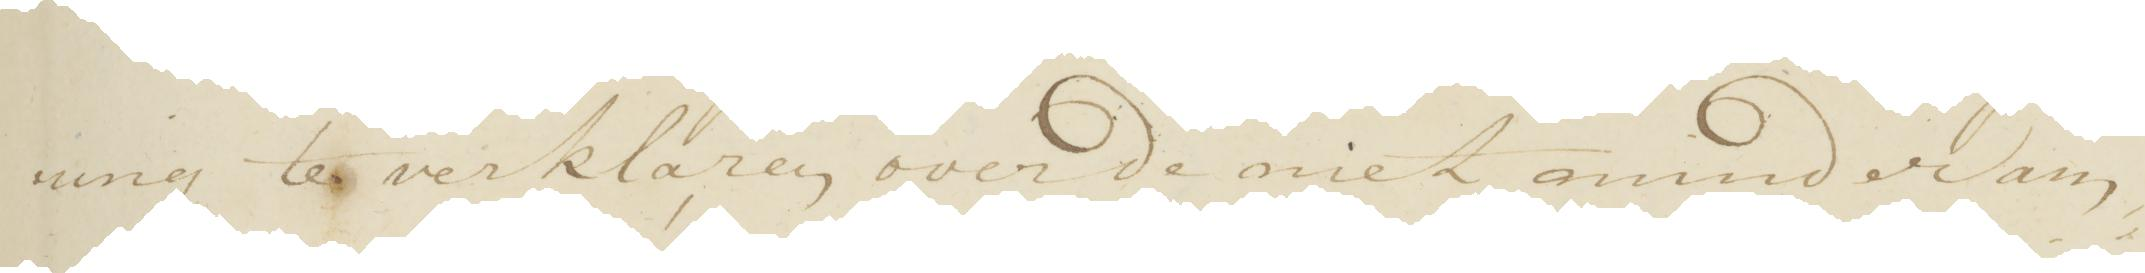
ring te verklaren over de niet minder am„
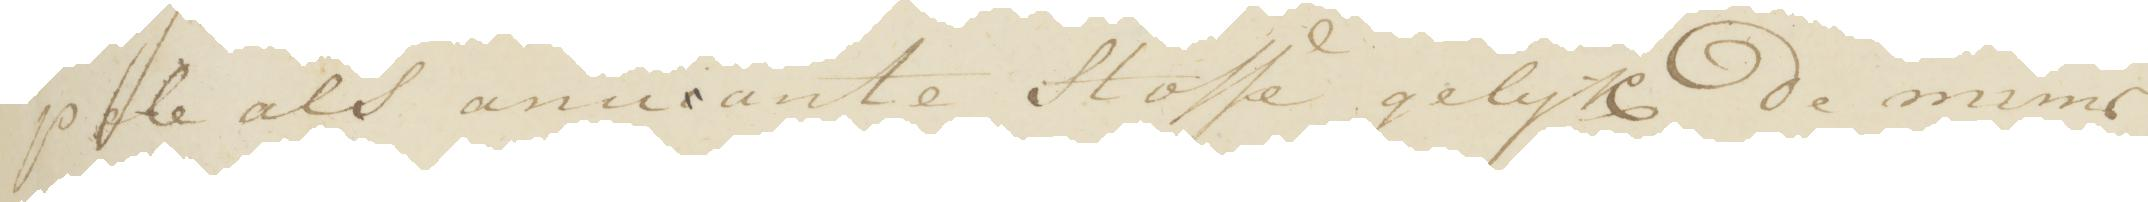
pele als anuiante Hoffe gelijk de minis
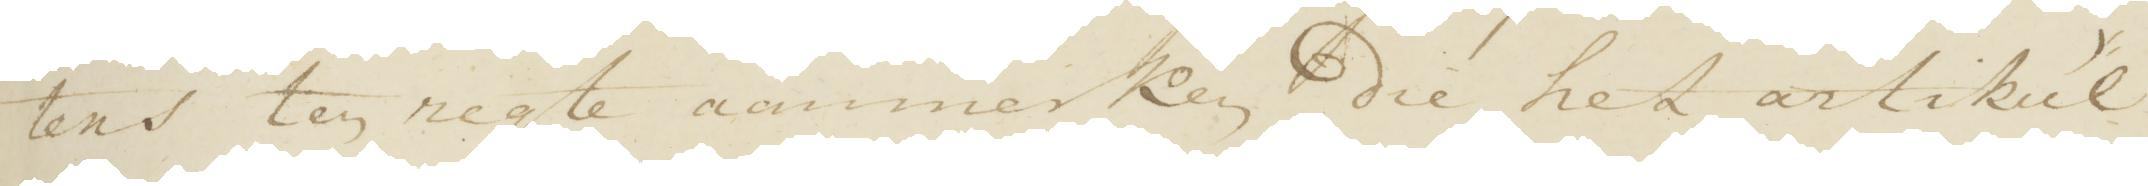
ters ten regte aanmerken die het artikul
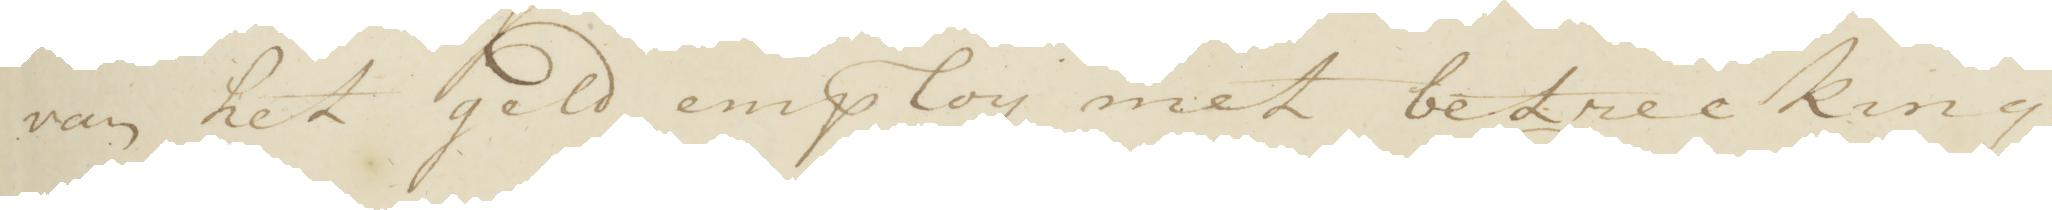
van het geld emploij met betrecking
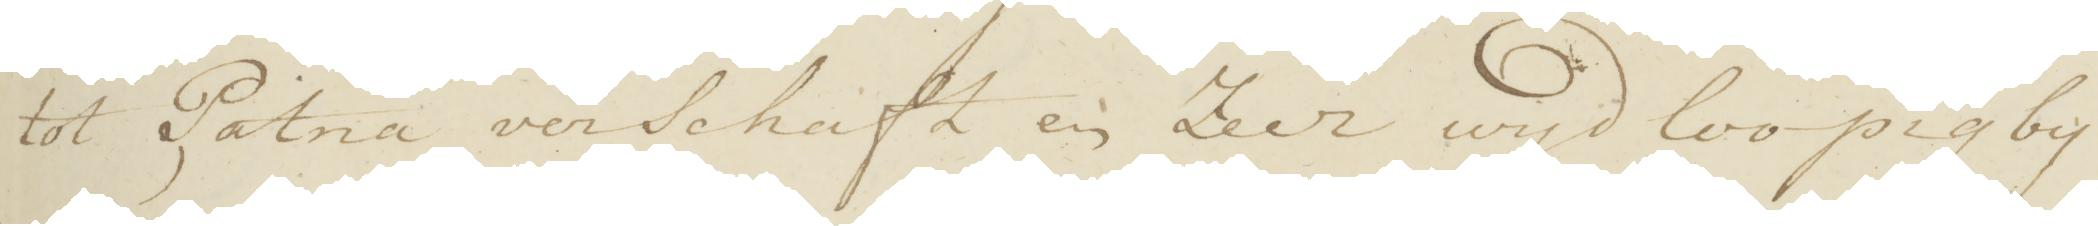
tot Patna verschaft en zeer wijd loopig bij
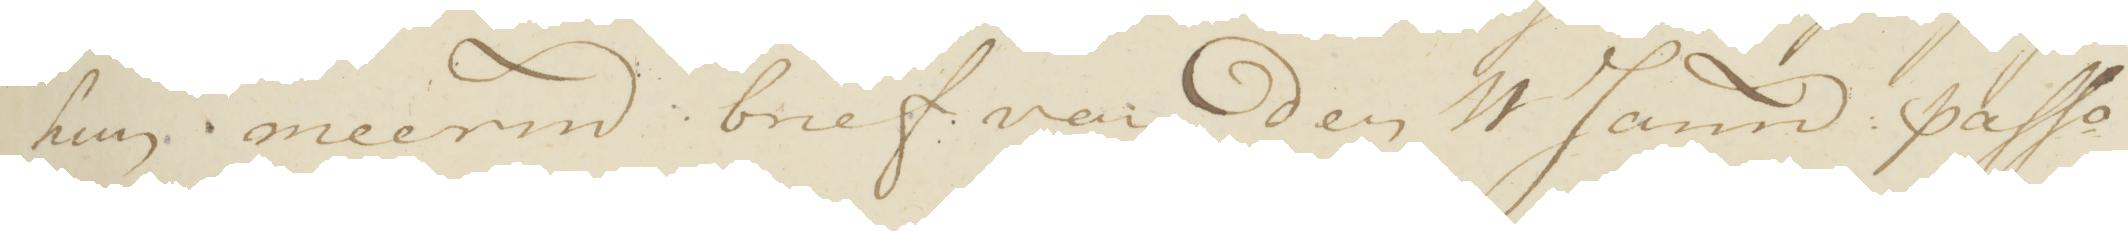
hun meernd brief van den 11 Jann: passo
